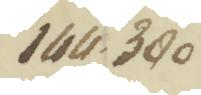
144. 380
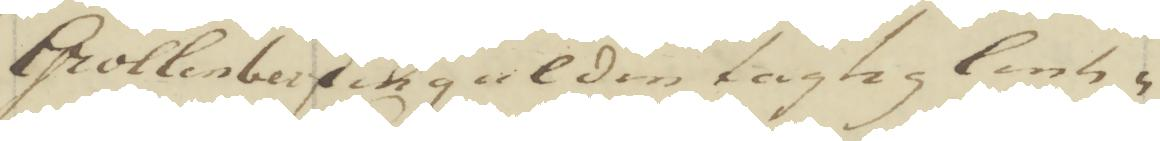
Grollenberg Een gulden tagtig Cents „
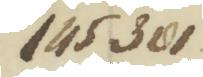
145 381
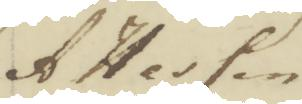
A Hessen
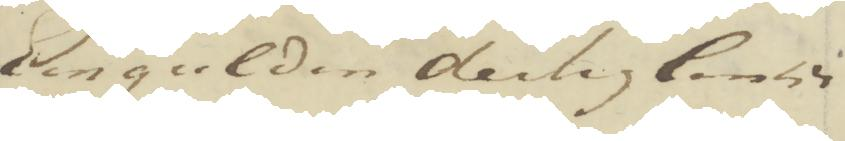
Een gulden dertig Cents
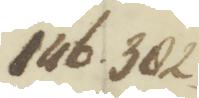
146. 382
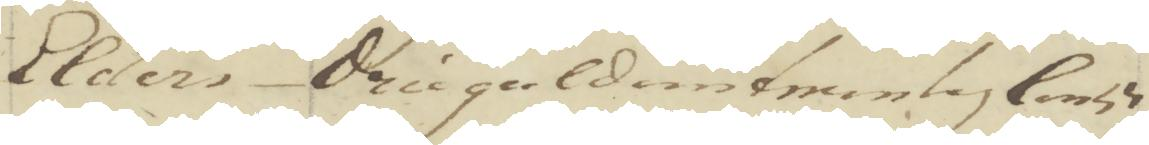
Elders — drie guldens twintig Cents
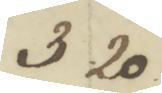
3. 20
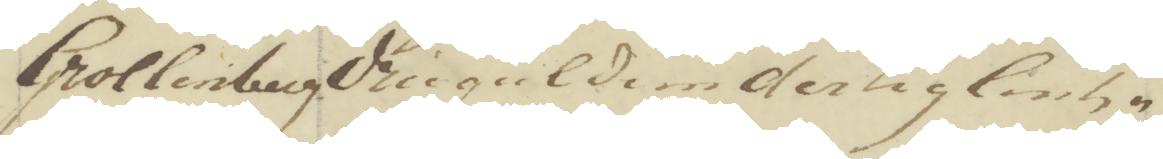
Grollenberg drie guldens dertig Cents
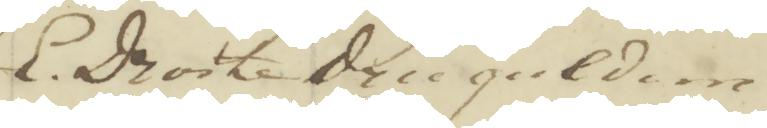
E. Droste drie guldens
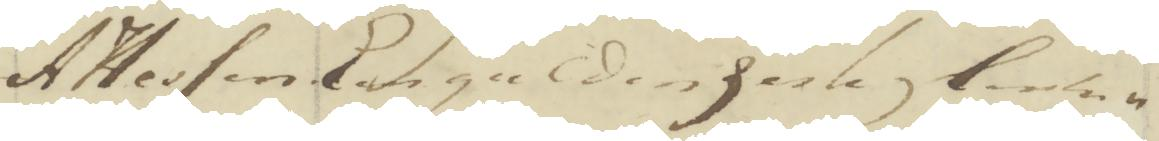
A Hessen Een gulden zestig Cents „
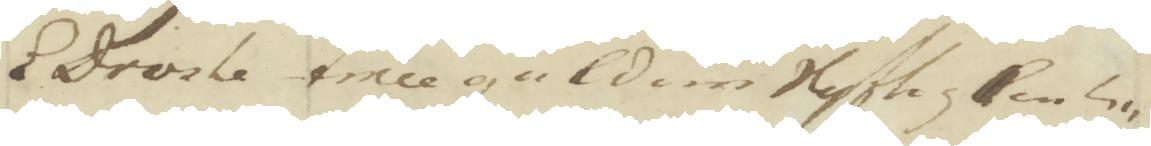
E Droste - twee guldens Vyftig Cents „
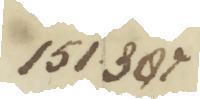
151. 387
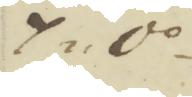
7 „ do
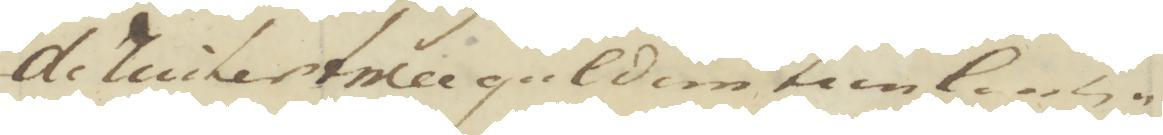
de ruiter twee guldens tien Cents „
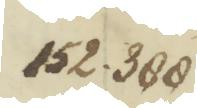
152. 388
